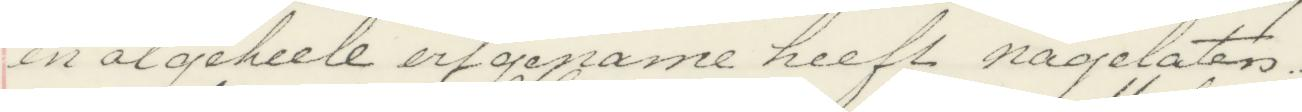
en algeheele erfgename heeft nagelaten
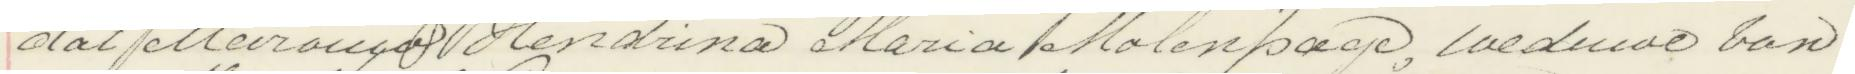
dat Mevrouw Hendrina Maria Molenpage, weduwe van
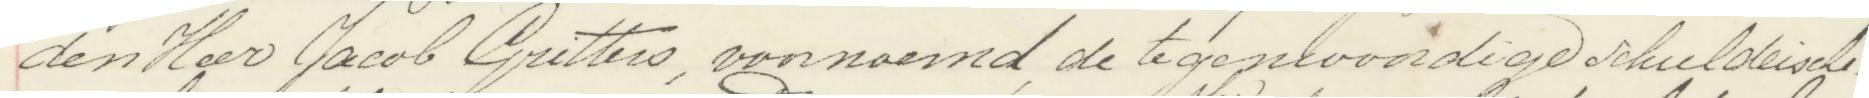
den Heer Jacob Gritters, voornoemd, de tegenwoordige schuldeische
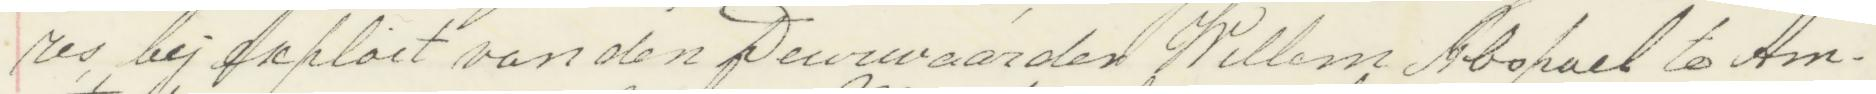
res, bij exploit van den Deurwaarden Willem Abspoel te Am-
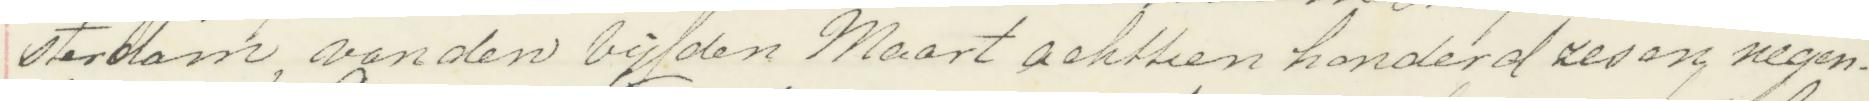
sterdam, van den vijfden Maart achttien honderd zes en negen
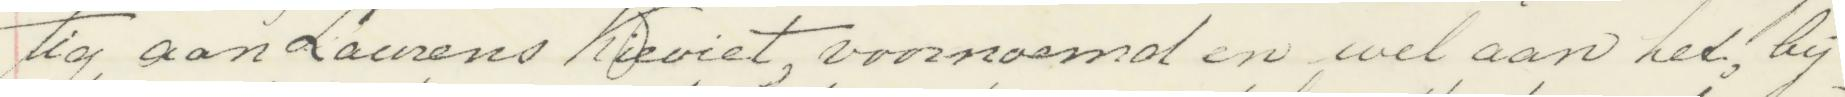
tig, aan Laurens Kieviet, voornoemd en wel aan het, bij
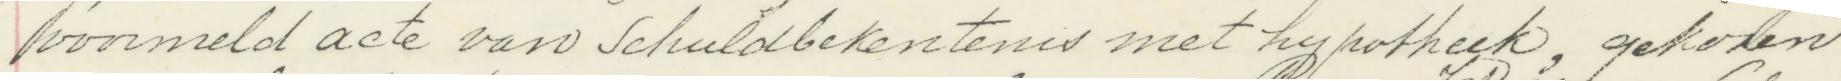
voormeld acte van Schuldbekentenis met hypotheek, gekozen
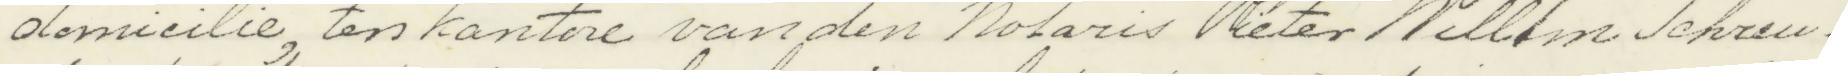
domicilie ten kantore van den Notaris Pieter Willem Schreu-
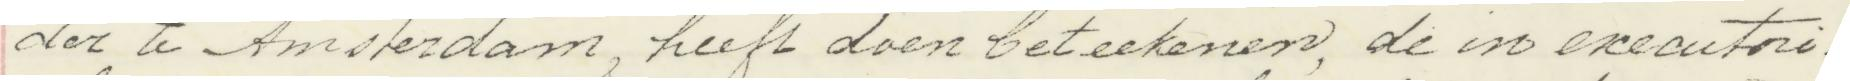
der te Amsterdam, heeft doen beteekenen, de in executori-
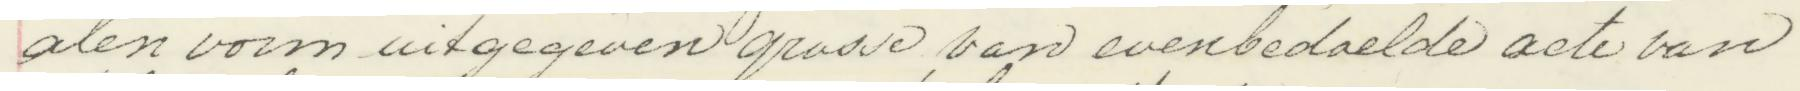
alen vorm uitgegeven grosse van evenbedoelde acte van
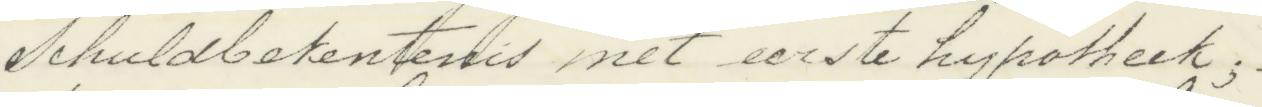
schuldbekentenis met eerste hypotheek;
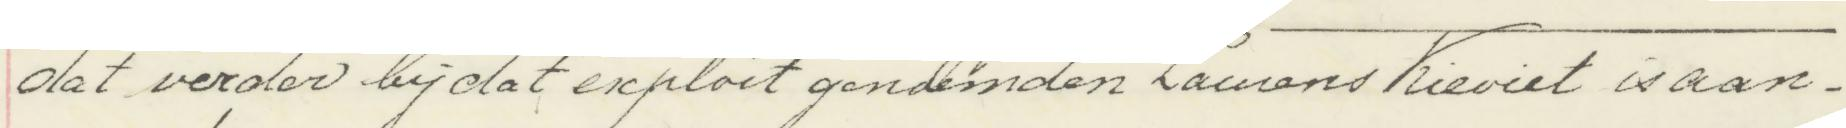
dat verder bij dat exploit genoemden Laurens Kieviet is aan-
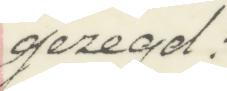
gezegd:
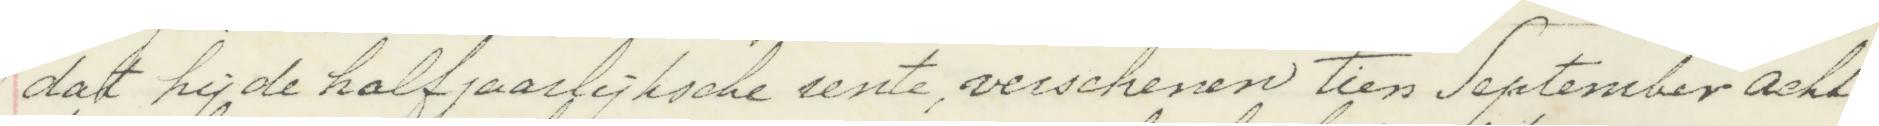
dat hij de half jaarlijksche rente, verschenen tien September acht-
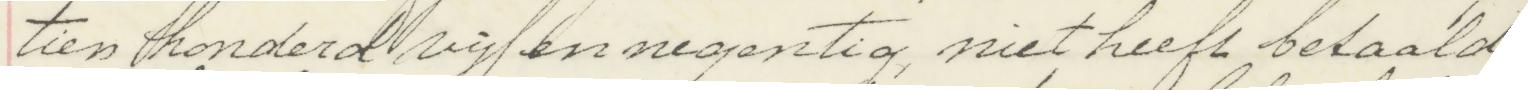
tien honderd vijf en negentig, niet heeft betaald
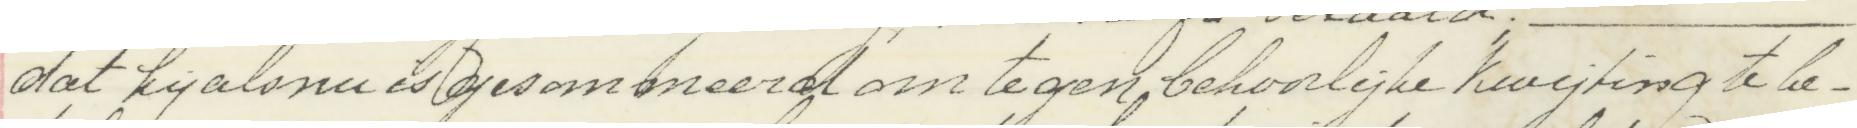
dat hij als nu is gesommeerd om tegen behoorlijke kwijting te be-
